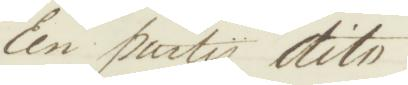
Een partij dito
